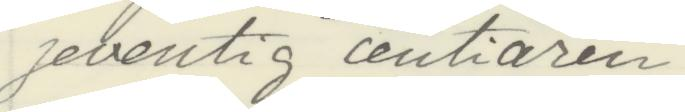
zeventig centiaren
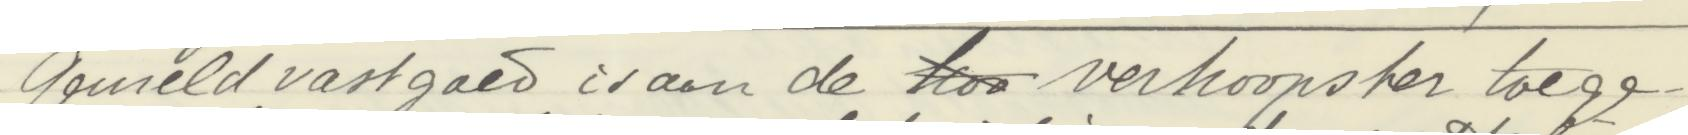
Gemeld vastgoed is aen de koo verkoopster toege
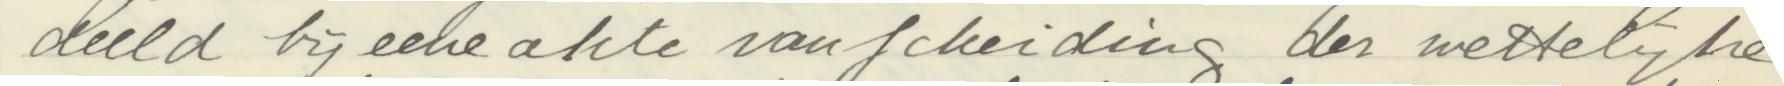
deeld bij eene akte van scheiding der wettelijke
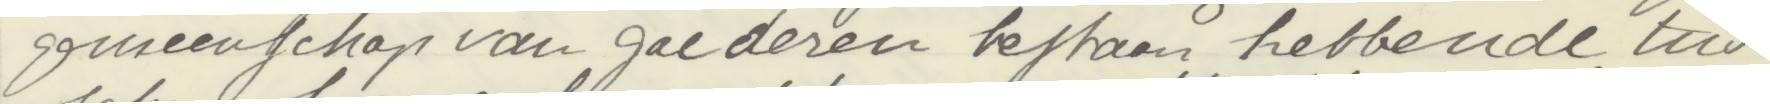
gemeenschap van goederen bestaan hebbende tus
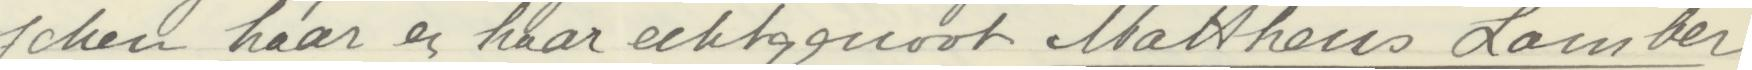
schen haar en haar echtegnoot Mattheus Lamber
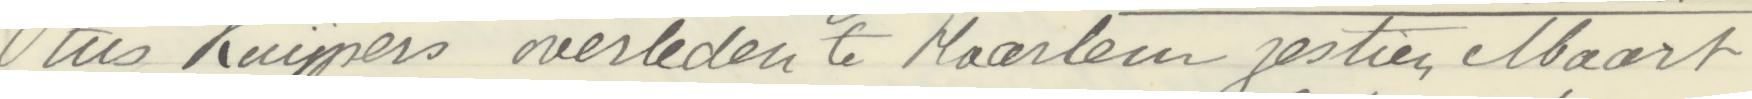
tus Kuijpers, overleden te Haarlem zestien Maart
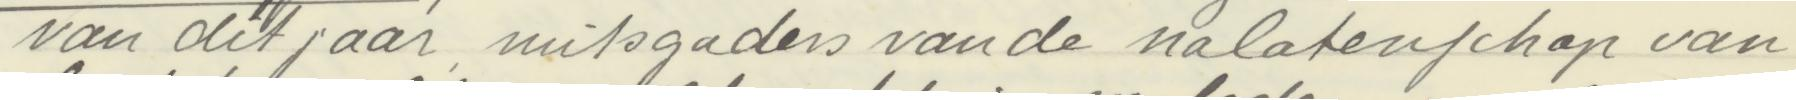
van dit jaar, mitsgaders van de nalatenschap van
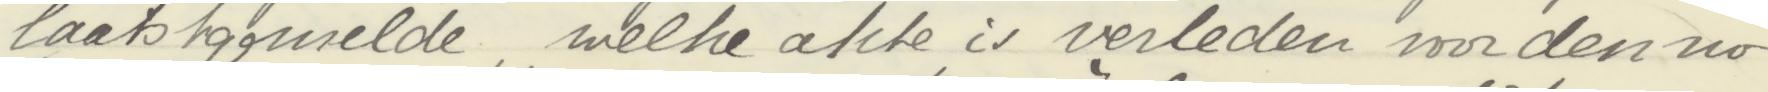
laatstgemelde, welke akte is verleden voor den no
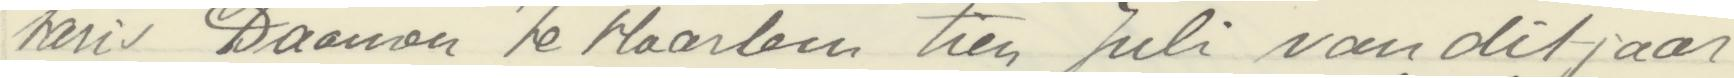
taris Daamen te Haarlem tien Juli van dit jaar
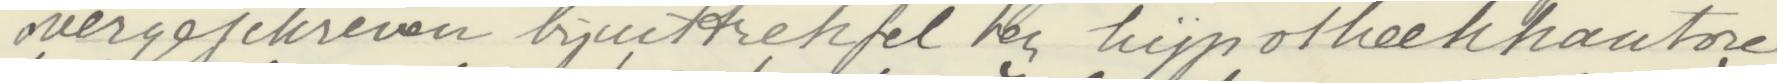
overgeschreven bij uittreksel ten hijpotheekkantore
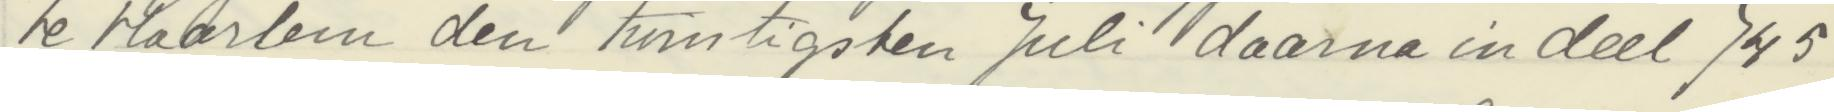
te Haarlem den twintigsten Juli daarna in deel 745
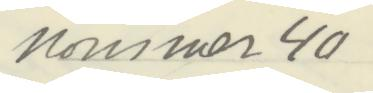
nommer 40
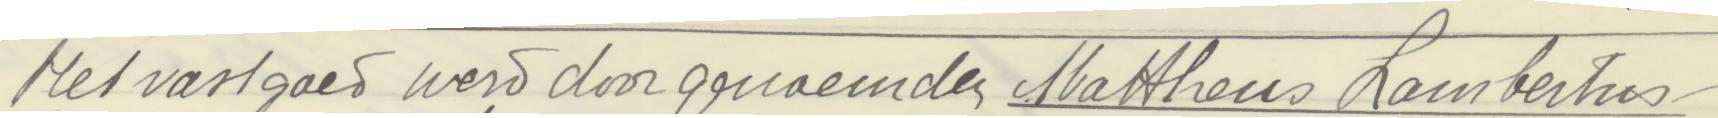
Het vastgoed werd door genoemden Mattheus Lambertus
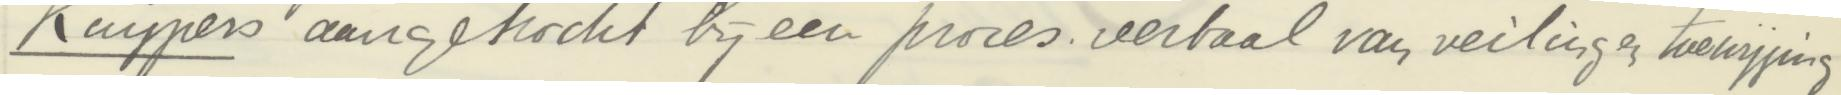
Kuijpers aangekocht bij een proces - verbaal van veilingen toewijzing
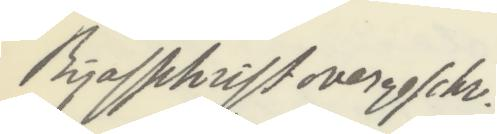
Bij afschrift overgeschr
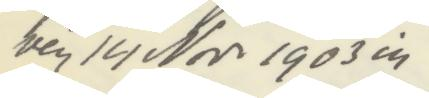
ven 19 Nov 1903 in
